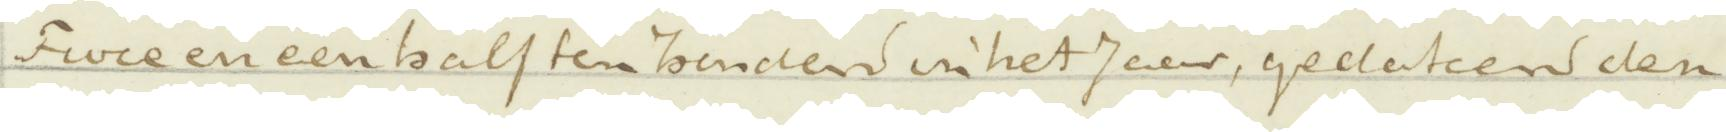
Twee en een half ten honderd in het Jaar, gedateerd den
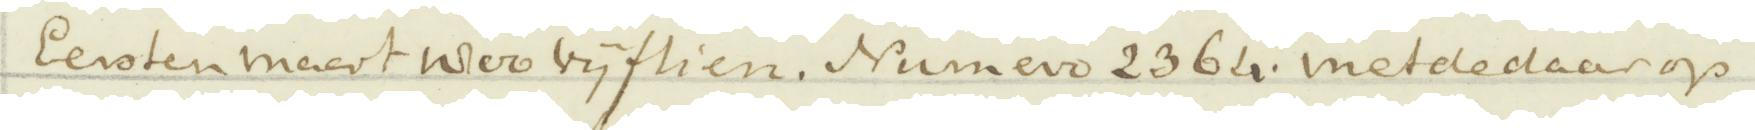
Eersten maart 1800 Vijftien Numero 2364. met de daar op
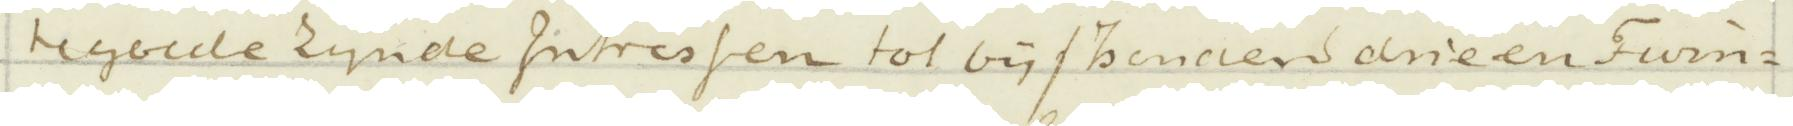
te goede Zynde Jntressen tot vijf honderd drie en Twin„
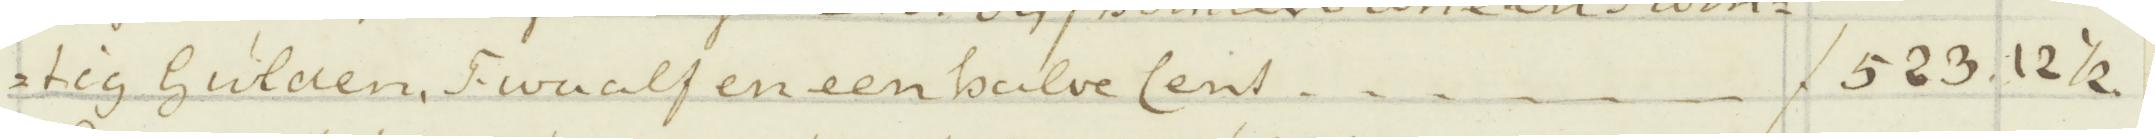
„tig Gulden Twaalf en een halve Cent- - - - - - -ƒ 523 .12½
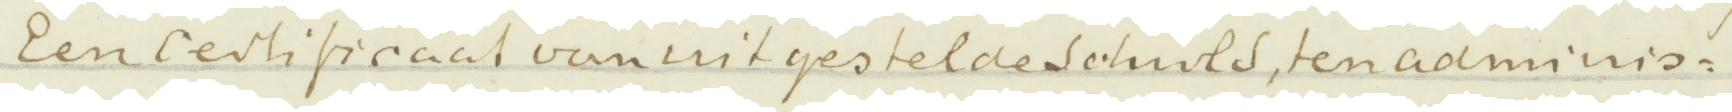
Een certificaat van uitgestelde schuld, ten adminis=
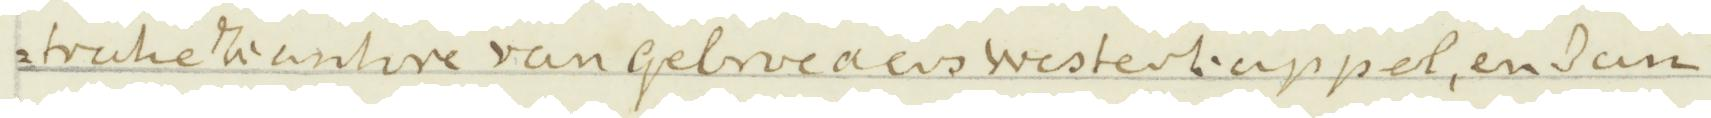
=tratie kantore van gebroeders Westerkappel, en Ian
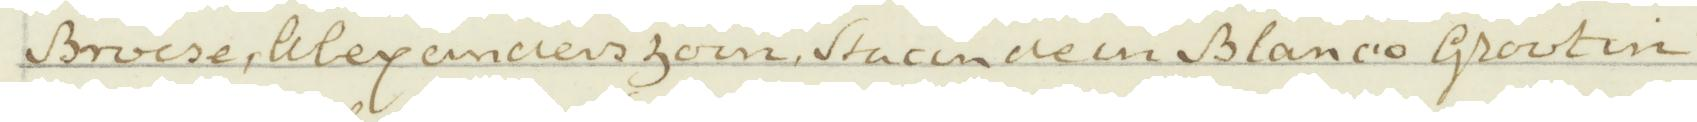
Broese, Alexanders zoon staande in Blanco Groot in
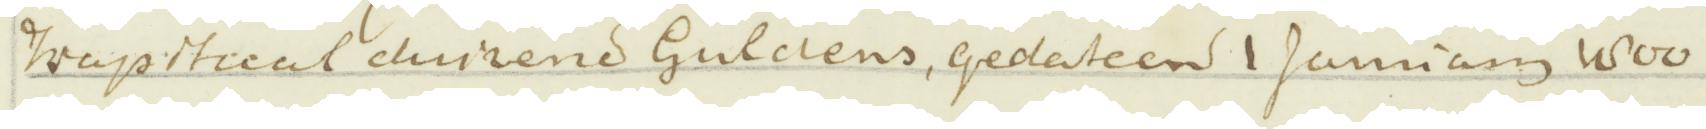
Kapitaal duizend Guldens, gedateerd 1 Januarij 1800
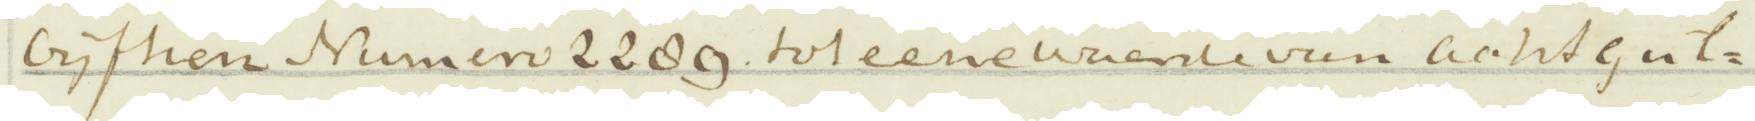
vijftien Numero 2289 tot een waarde van acht gul=
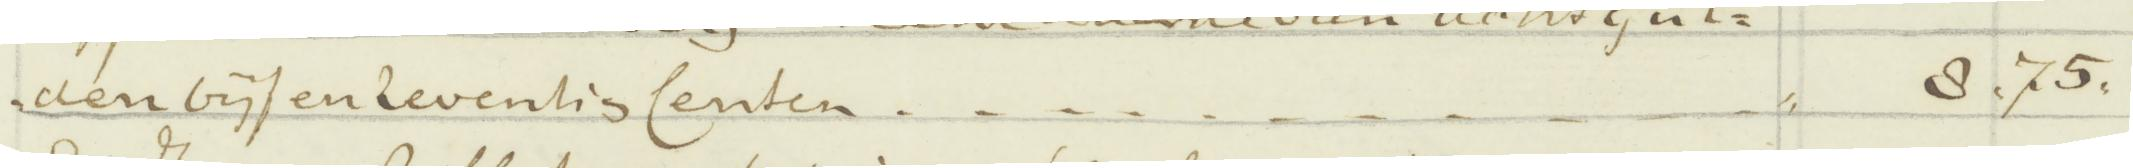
„den vijfen Zeventig Centen - - - - - - - - - - - „ 8„ 75 „
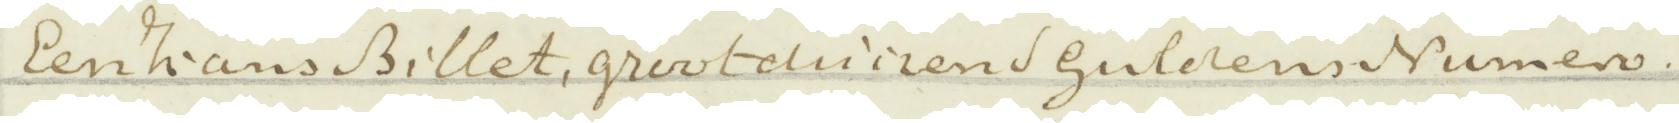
Een kans Billet, grootduizend guldens Numero.
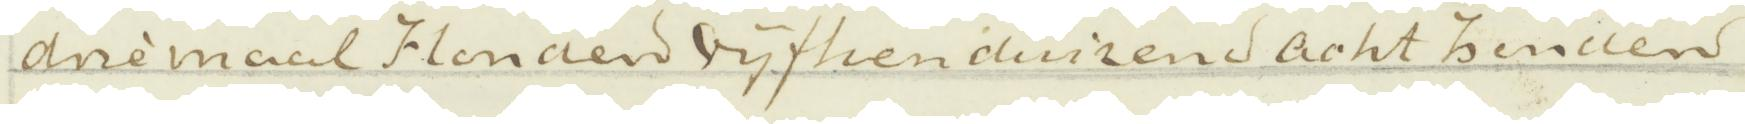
drie maal Honderd vijftien duizend acht honderd
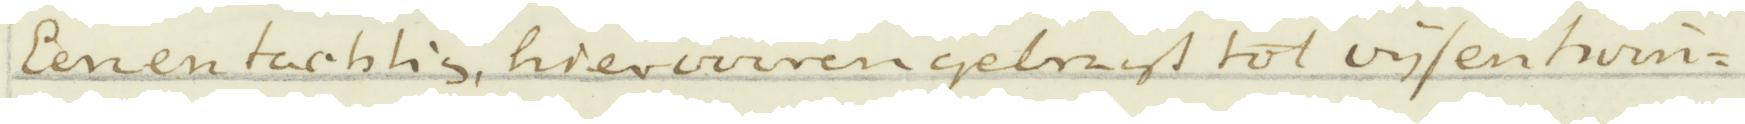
Een en tachtig hiervooren gebragt tot vijfen twin„
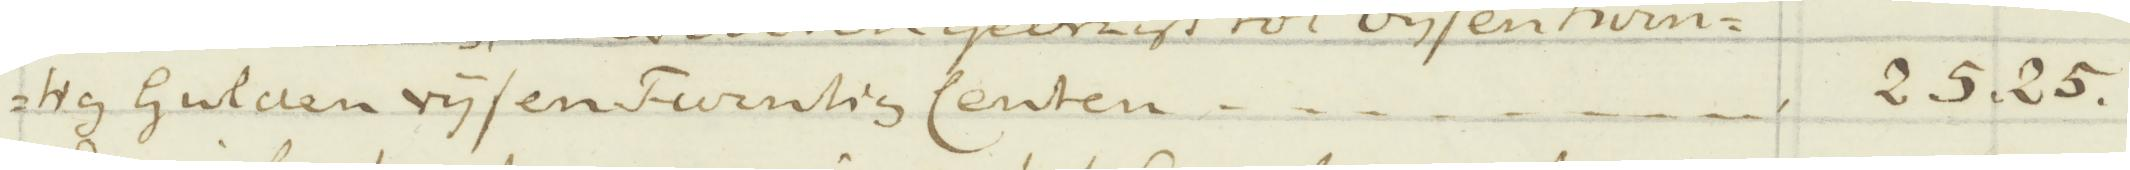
„tig Gulden vijfen Twintig Centen - - - - - - - - -„ 25 „ 25 „
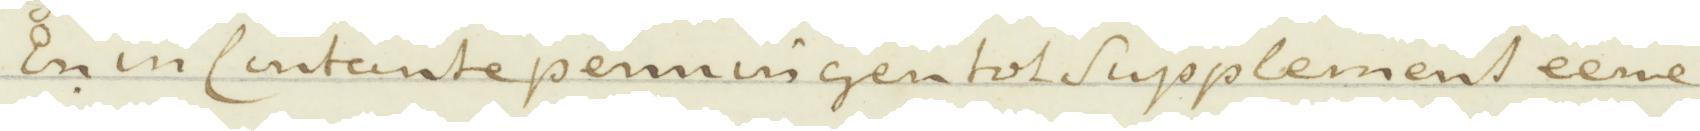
En in Contante penningen tot Supplement eene
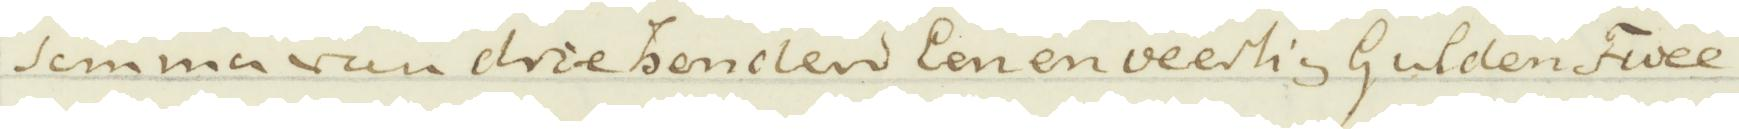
somma van drie honderd Een en veertig Gulden Twee
